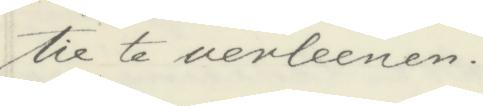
tie te verleenen
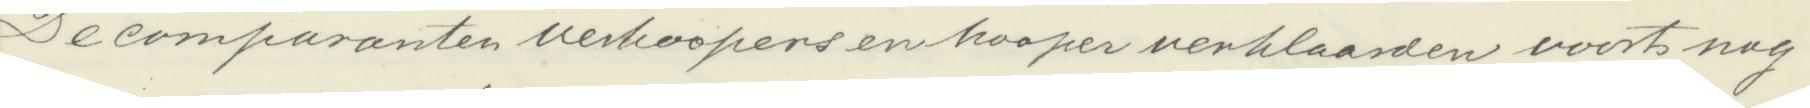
De comparanten verkoopers en kooper verklaarden voorts nog
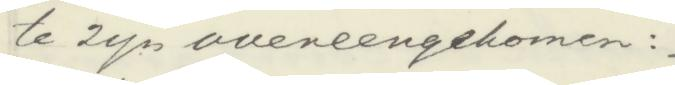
te zijn overeengekomen:
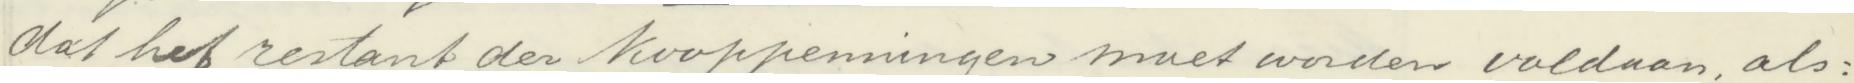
dat het restant der kooppenningen moet worden voldaan, als
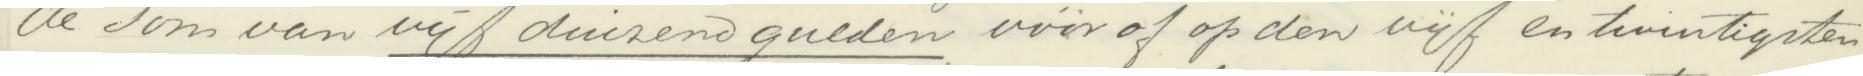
de som van vijf duizend gulden vóór of op den vijf en twintigsten
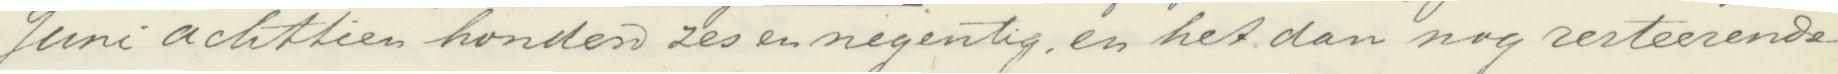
Juni achttien honderd zes en negentig, en het dan nog resteerende
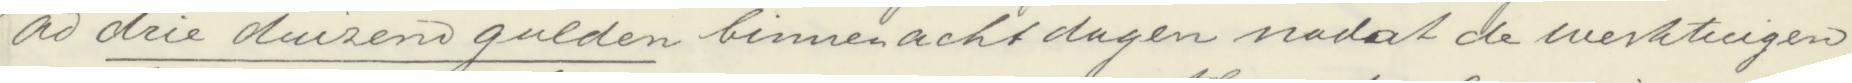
ad drie duizend gulden binnen acht dagen nadat de werktuigen
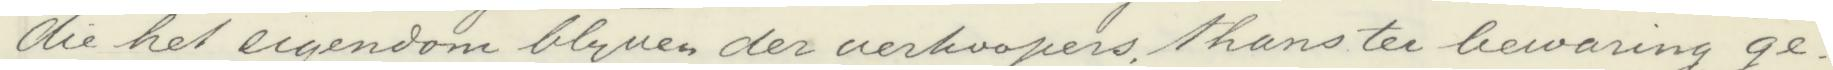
die het eigendom blyven der verkoopers, thans ter bewaring ge„
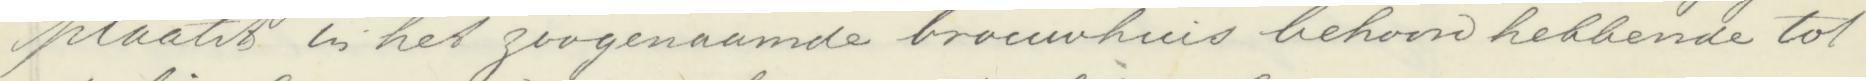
plaatst in het zoogenaamde brouwhuis behoord hebbende tot
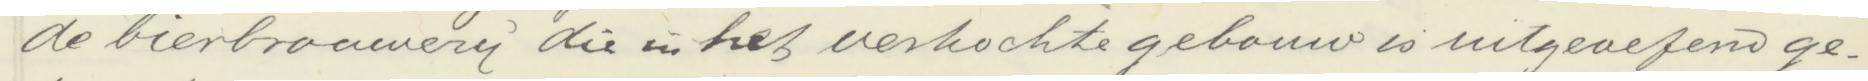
de bierbrouwerij die in het verkochte gebouw is uitgeoefend ge-
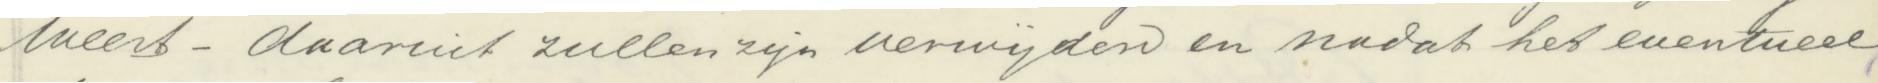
weest - daaruit zullen zijn verwijderd en nadat het eventueel
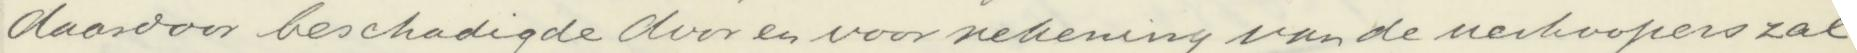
daardoor beschadigde door en voor rekening van de verkoopers zal
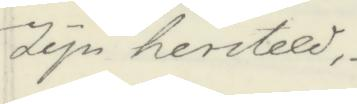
zijn hesteld,
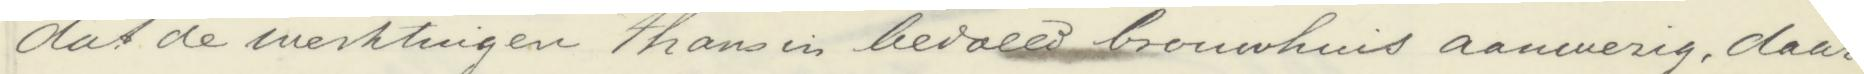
dat de werktuigen thans in bedoeld brouwhuis aanwezig, daar
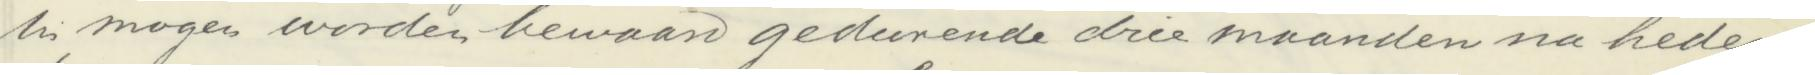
in mogen worden bewaard gedurende drie maanden na heden
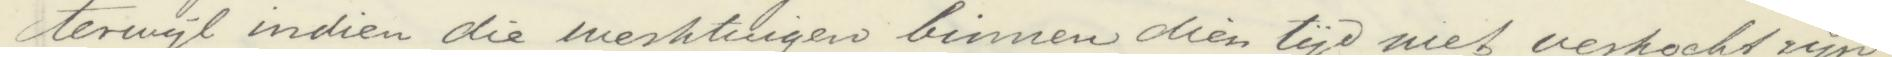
terwijl indien die werktuigen binnen dien tijd niet verkocht zijn
